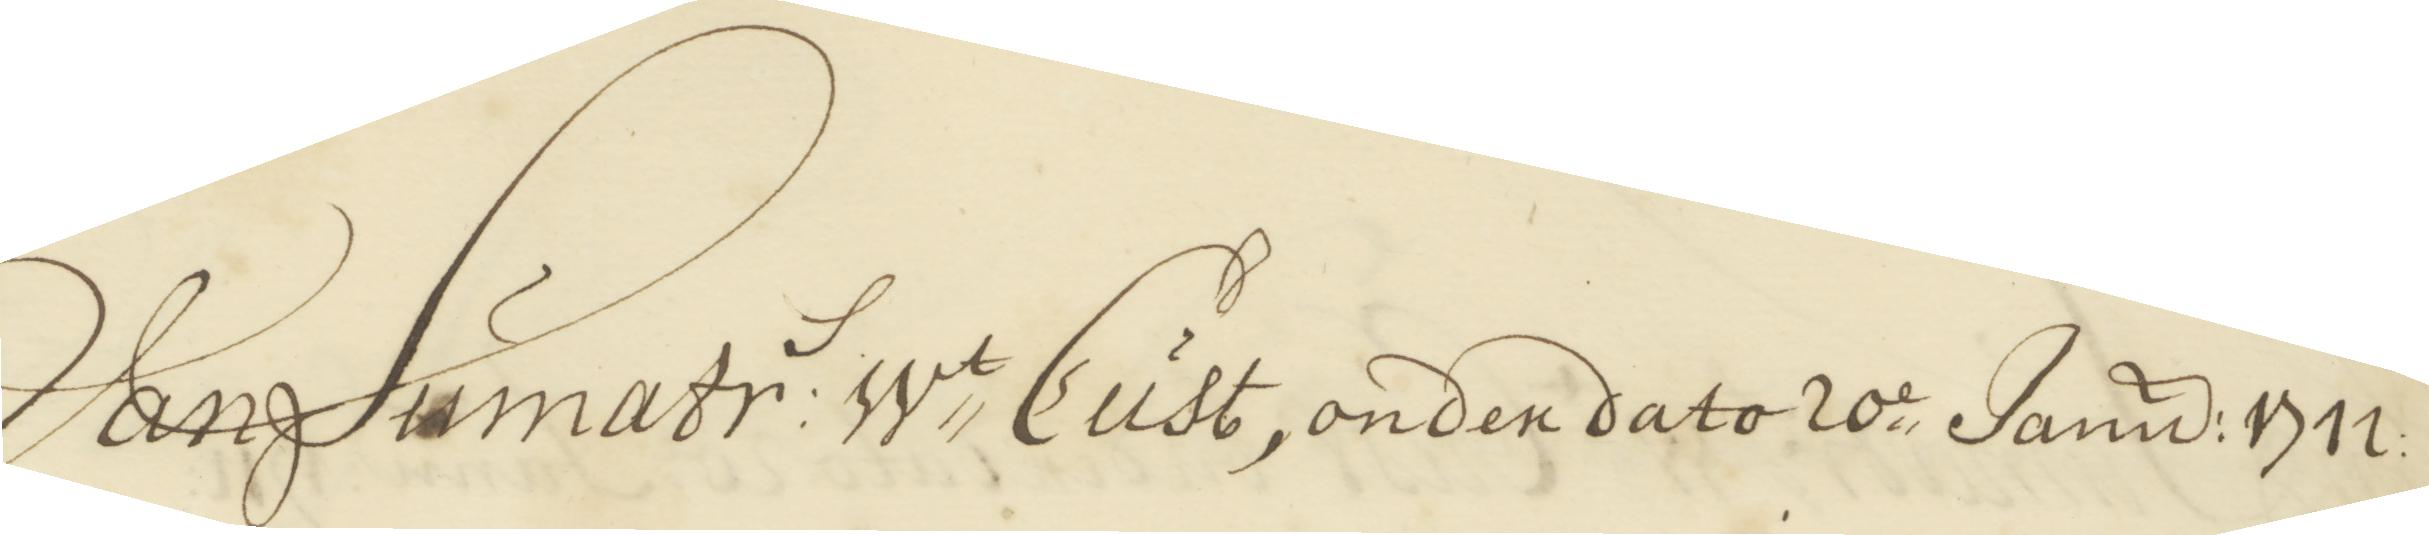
Van Sumastr:s W„t Cust, onder dato 20„e Jann: 1711:
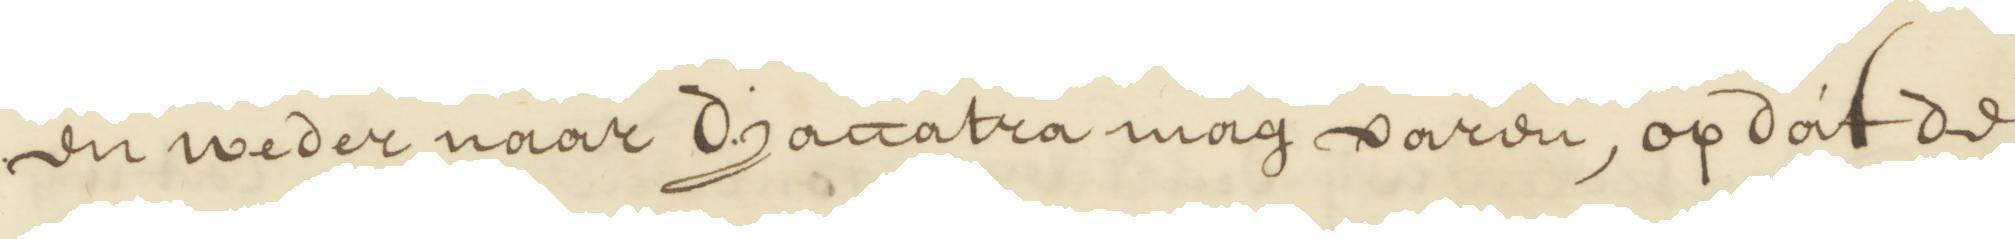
en weder naar Djaccatra mag varen, op dat de
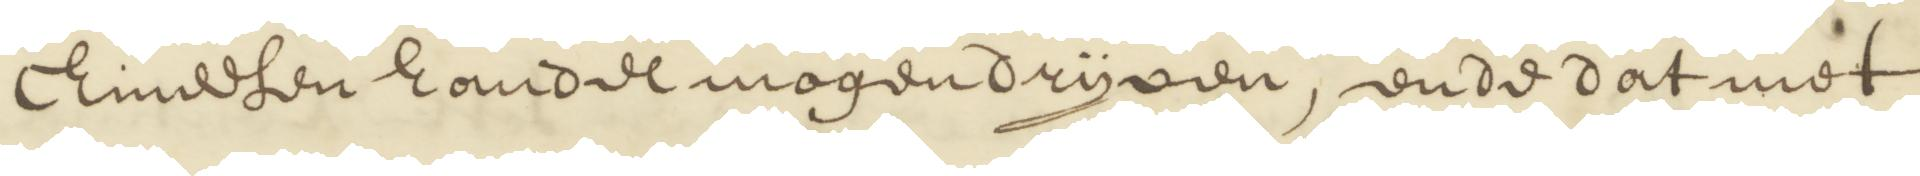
Chineesen handel mogen drijven, ende dat met
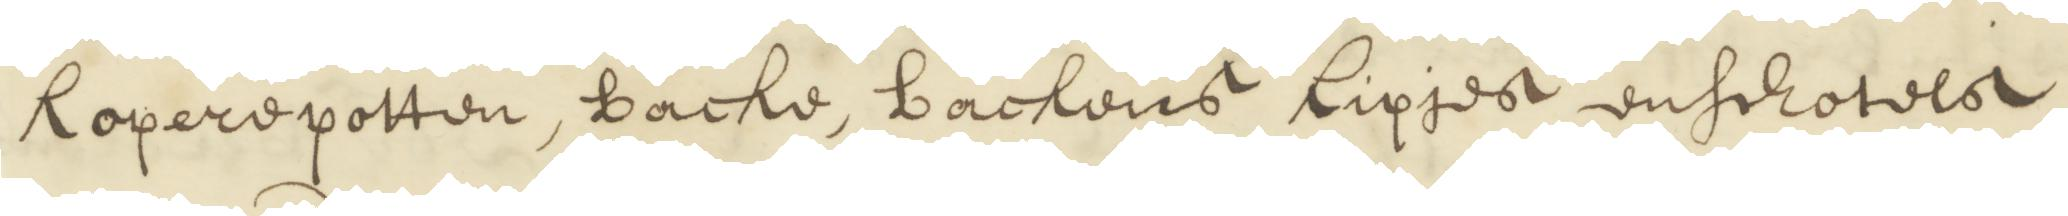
koperepotten, backe, backens kipjes en schotels,
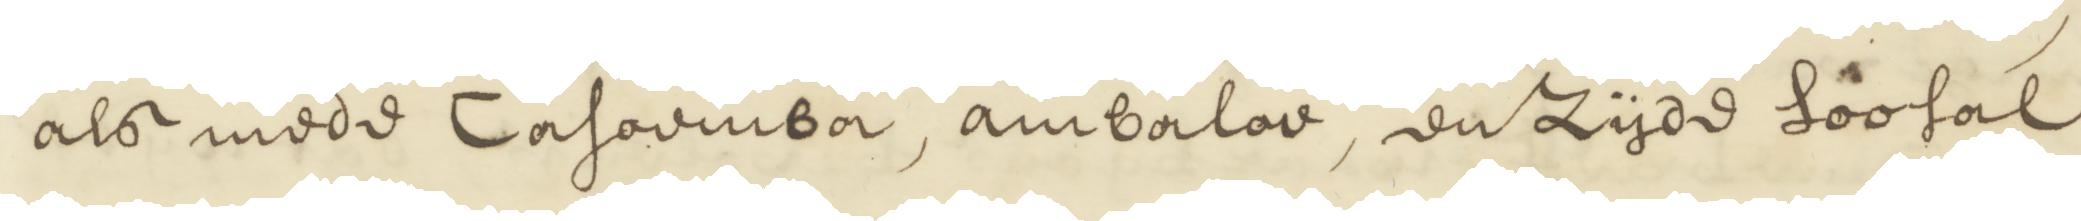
als mede Casoemba, ambaloe, en Zijde Soo sal
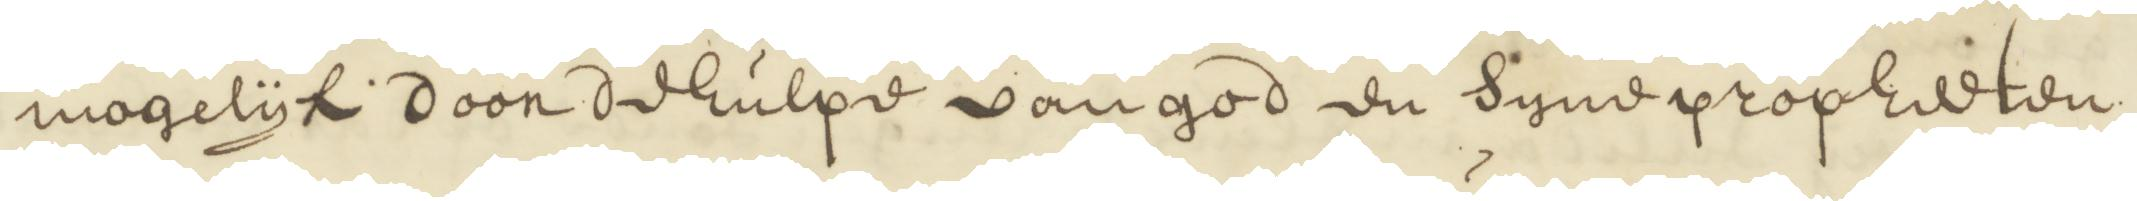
mogelijk door dehulpe van god en sijne propheeten,
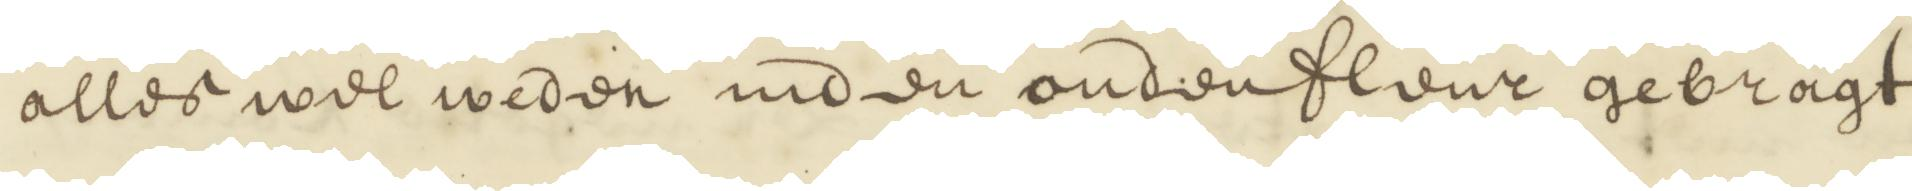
alles wel weder inden ouden fleur gebragt
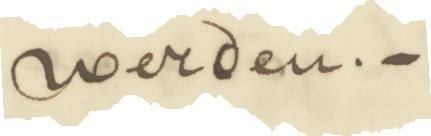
werden.-
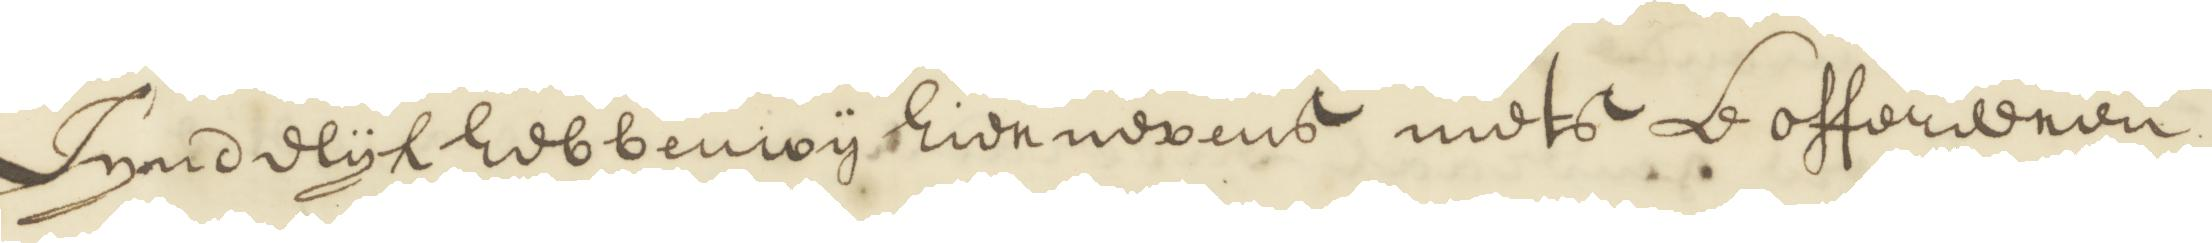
Eyndelijk hebben wij hier nevens niets te offereeren
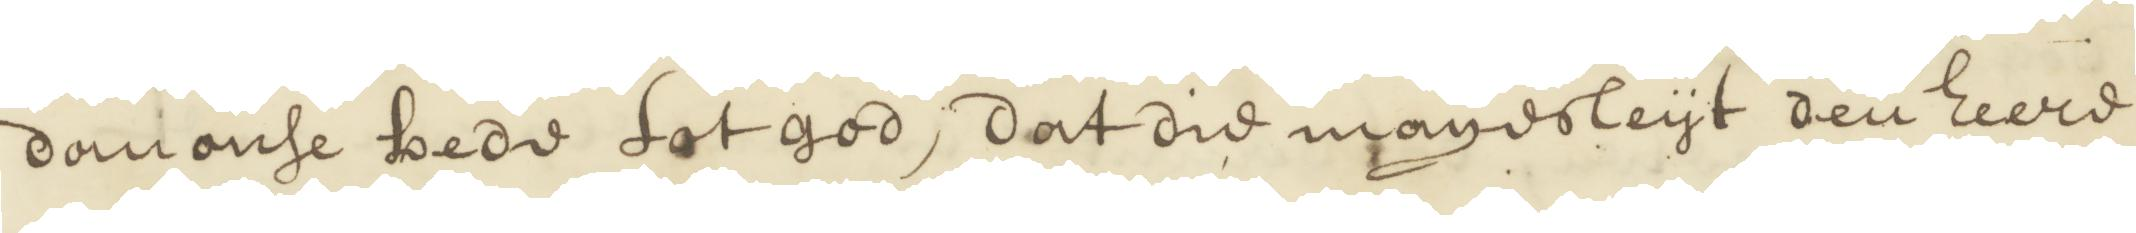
dan onse bede tot god, dat die maijesteijt den heere
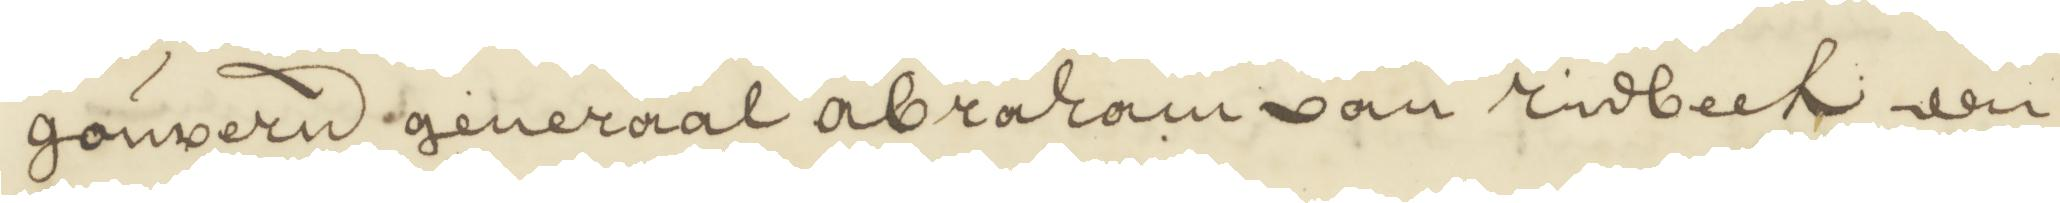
gouvern generaal abraham van riebeek een
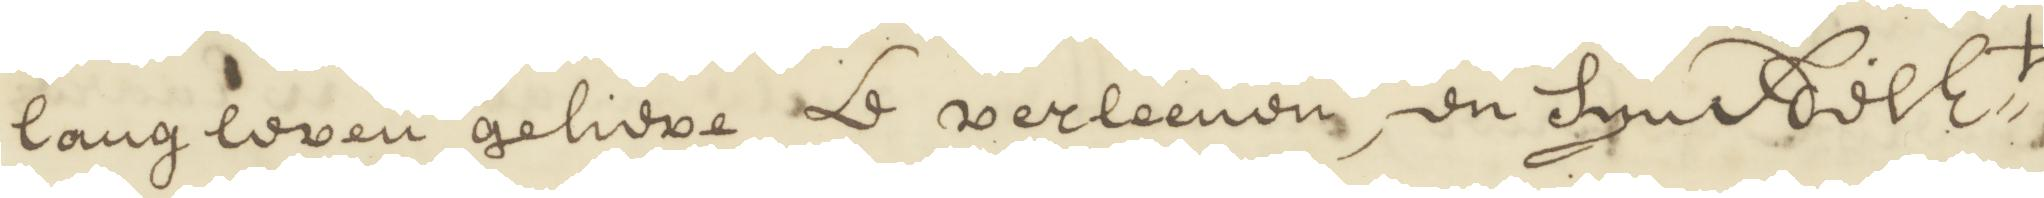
lang leven gelieve te verleenen, en syn Edelh„t
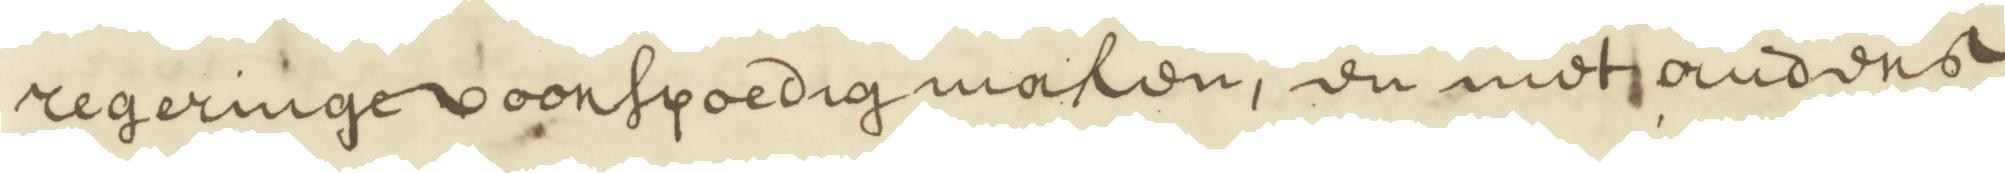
regeringe voor spoedig maken, en niet anders
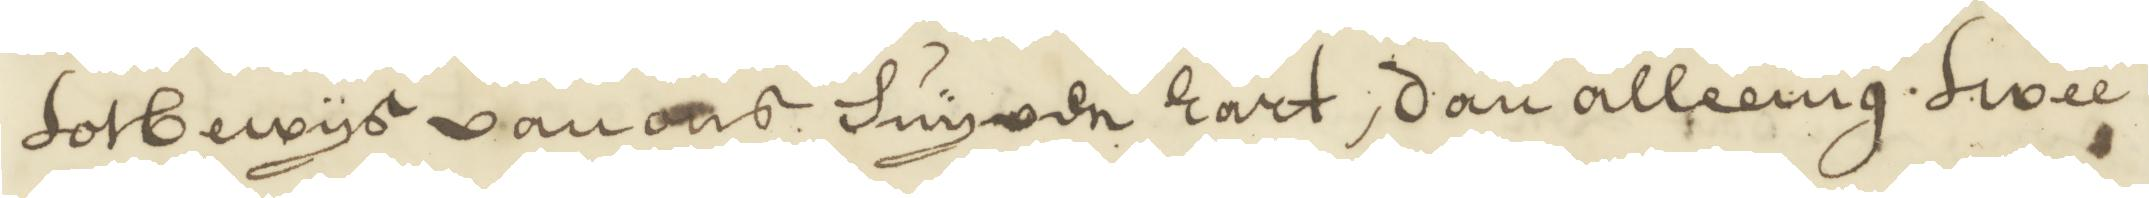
tot bewijs van ons suijver hart ,dan alleenig twee
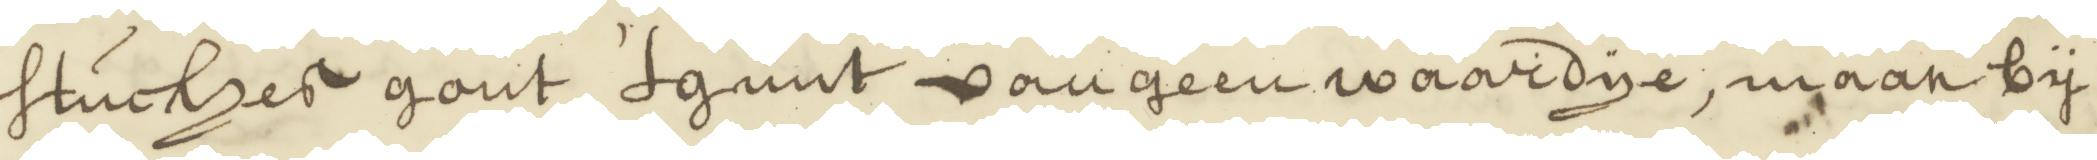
stuckjes gout, 'tgunt van geen waardije, maar bij
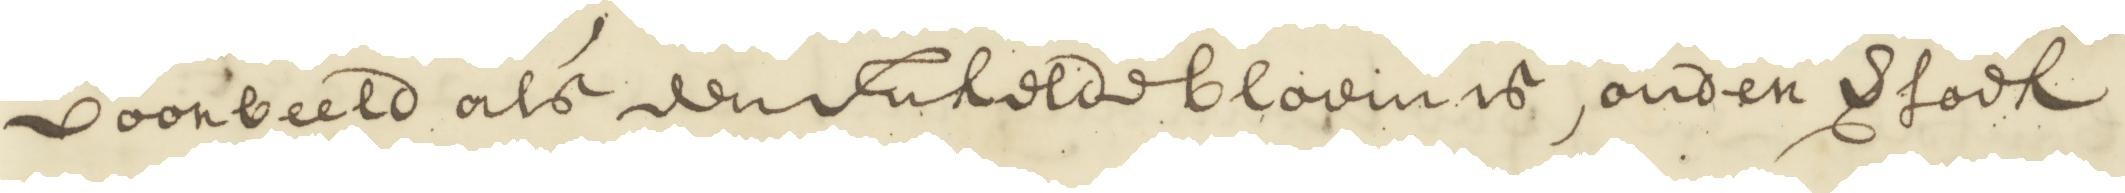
voorbeeld als een Enkelde bloem is ,onder versoek
